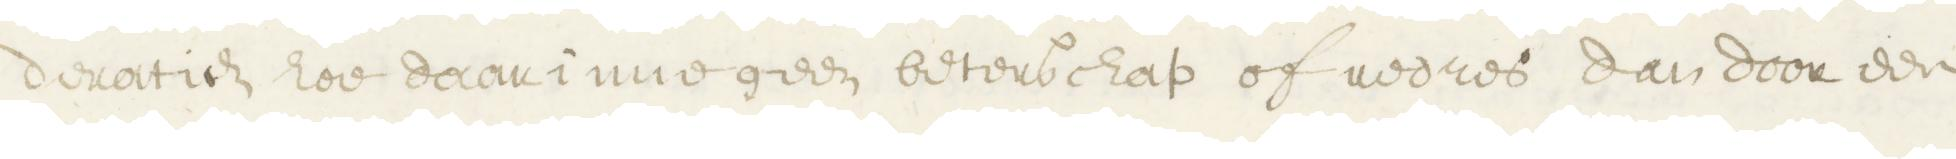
deratien hoe daar inne geen beterschap of redres dan door een
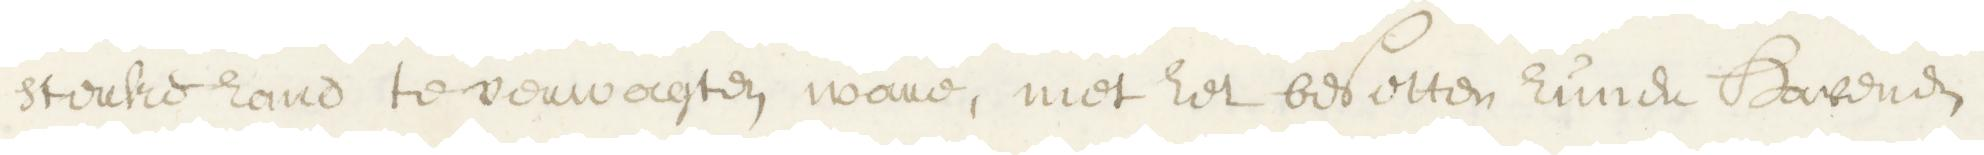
sterke hand te verwagten ware, met het besetten huner Havenen
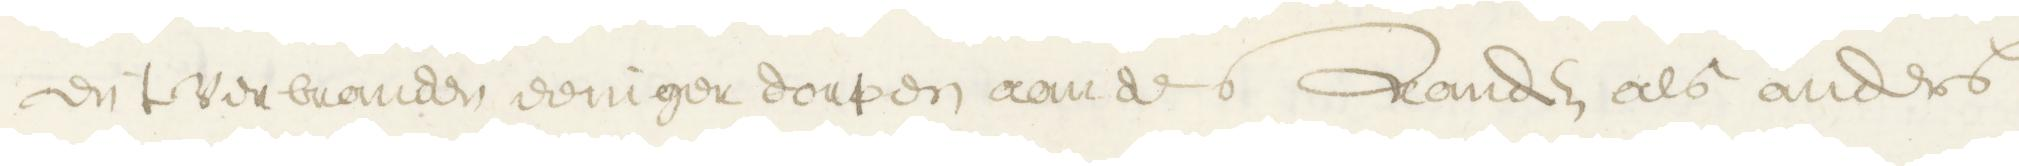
en ’t verbranden eeniger dorpen aan de stranden als anders
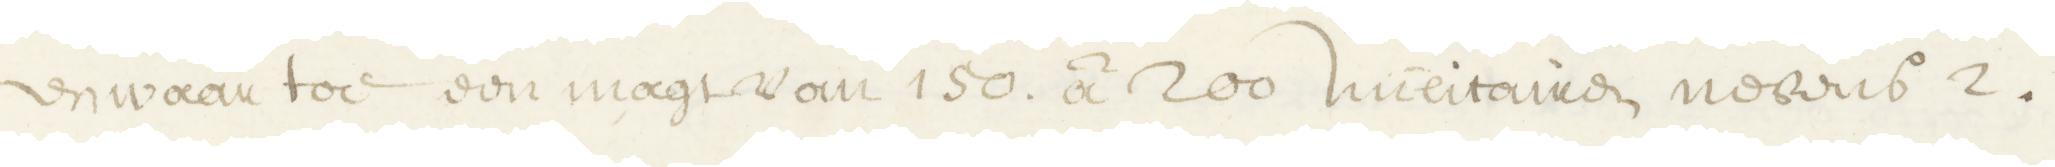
en waar toe een magt van 150. â 200 militairen nevens 2.
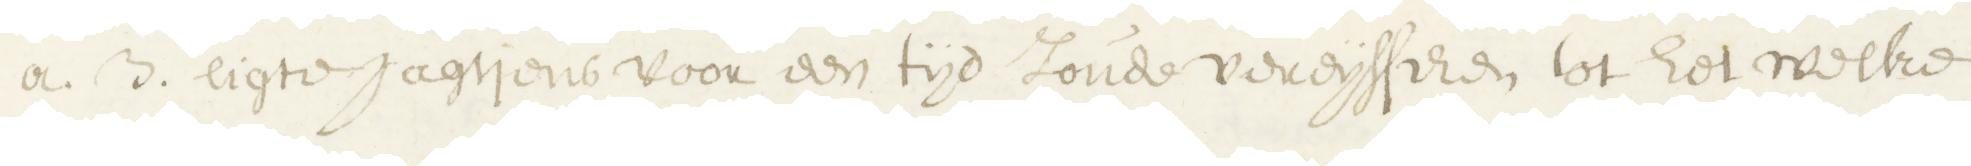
a. 3. ligte jagtjens voor een tijd Zoude vereijsseren tot het welke
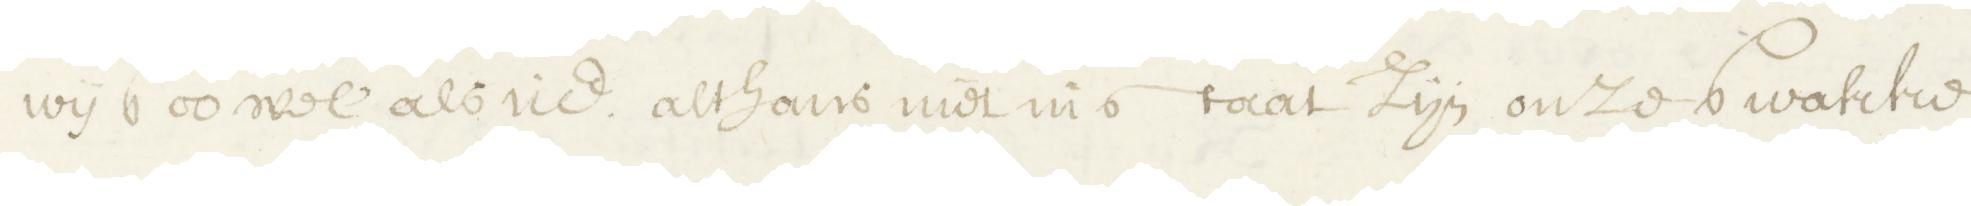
wij soo wel als uE. althans niet in staat Zijn onze swakke
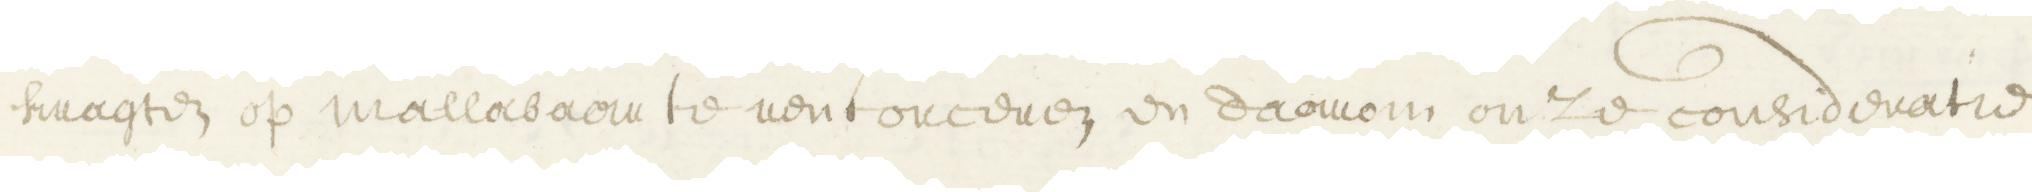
kragten op mallabaar te renforceren en daarom onze consideratie
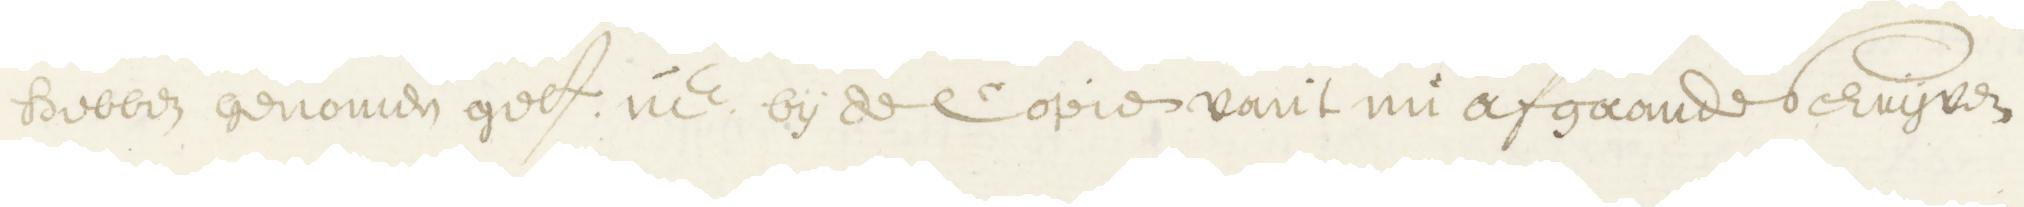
hebben genomen gelijk uE. bij de Copie van ’t nu afgaande schrijven
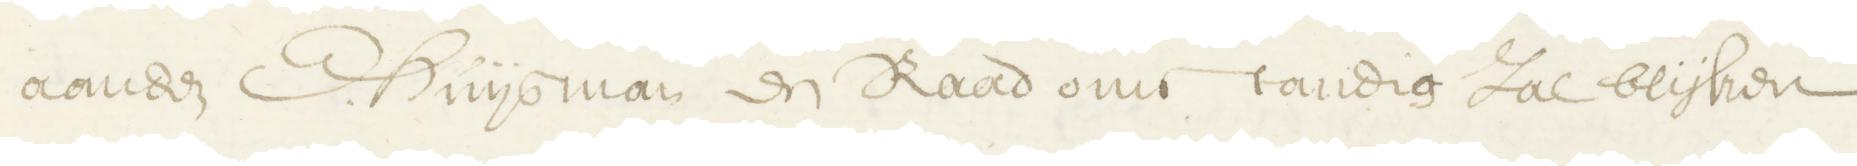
aanden E. Huijsman en Raad omstandig Zal blijken
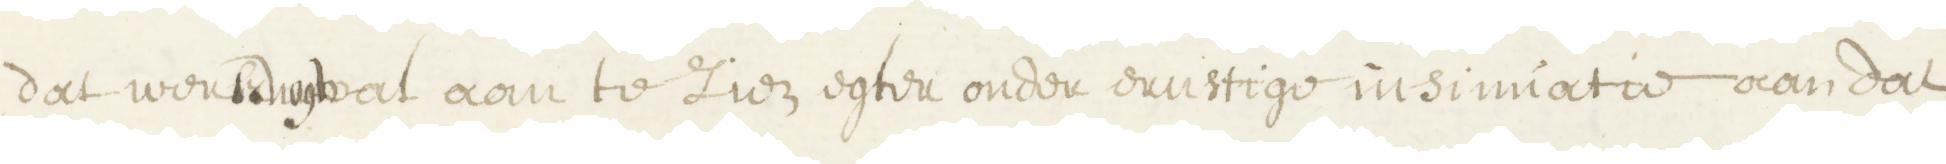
dat werk nogwat aan te Zien egter onder ernstige insinuatie aan dat
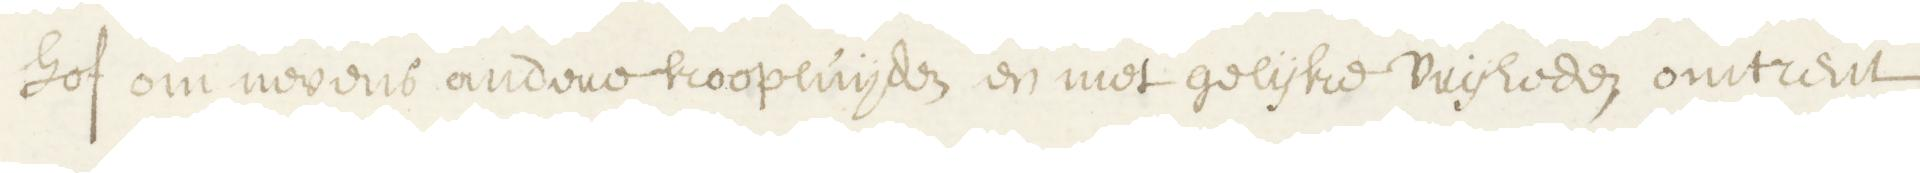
hof om nevens andere koopluijden en met gelijke vrijheden omtrent
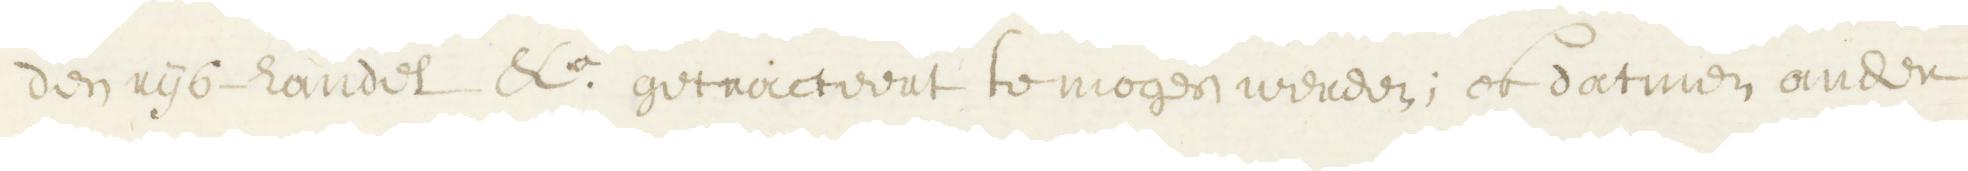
den rijs-handel &.a getracteert te mogen werden; of dat men ander
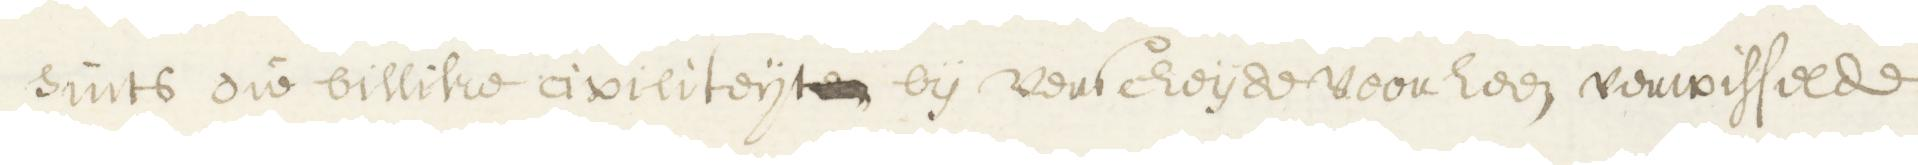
sints die billike civiliteijten bij verscheijde voor heen verwisselde
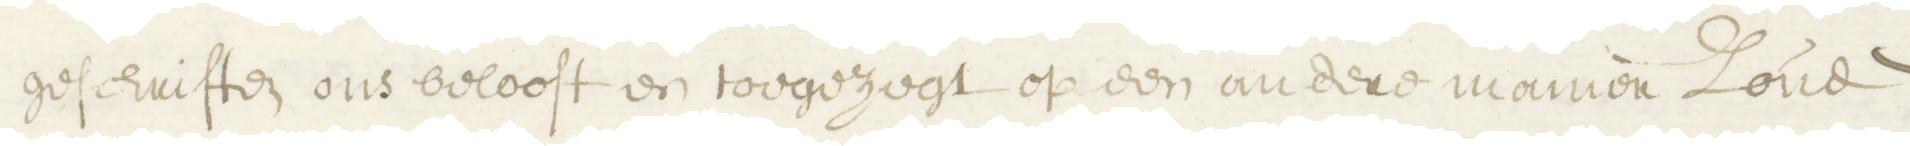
geschriften ons belooft en toegezegt op een andere manier Zoude
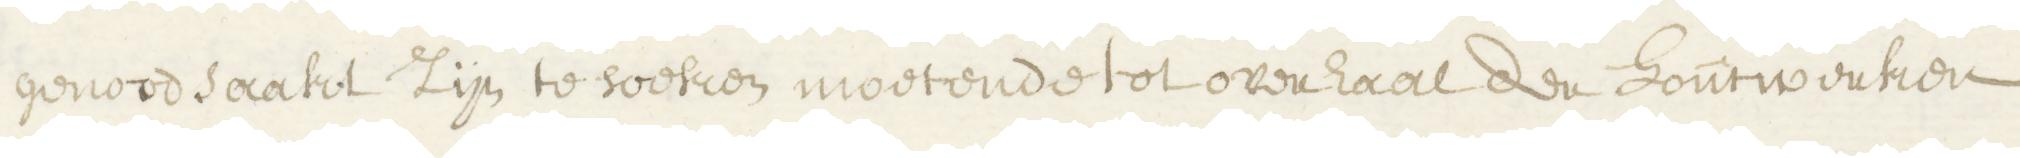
genoodsaakt Zijn te soeken moetende tot overhaal der houtwerken
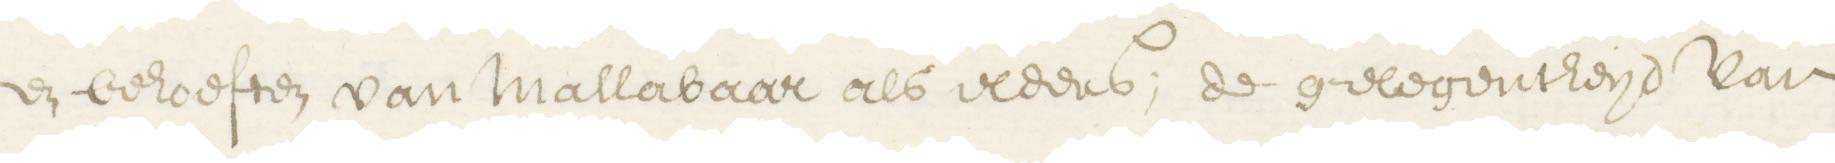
en behoeften van Mallabaar als elders; de gelegentheijd van
